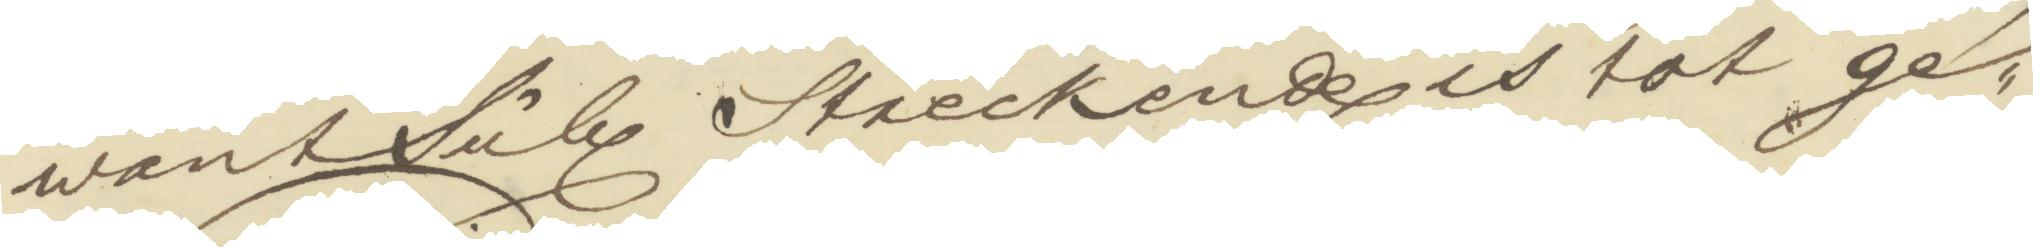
want sulx streckende is tot ge„
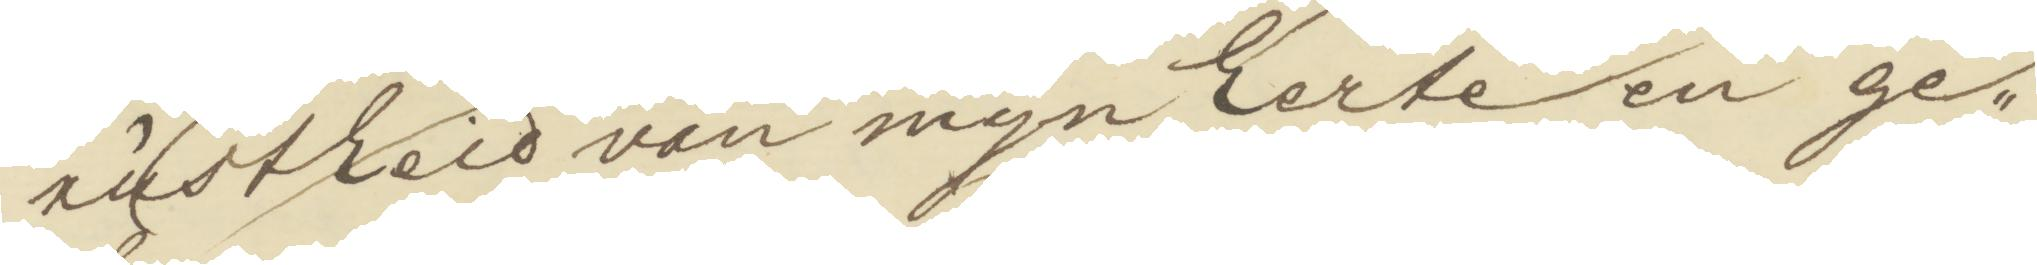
rustheid van mijn herte en ge„
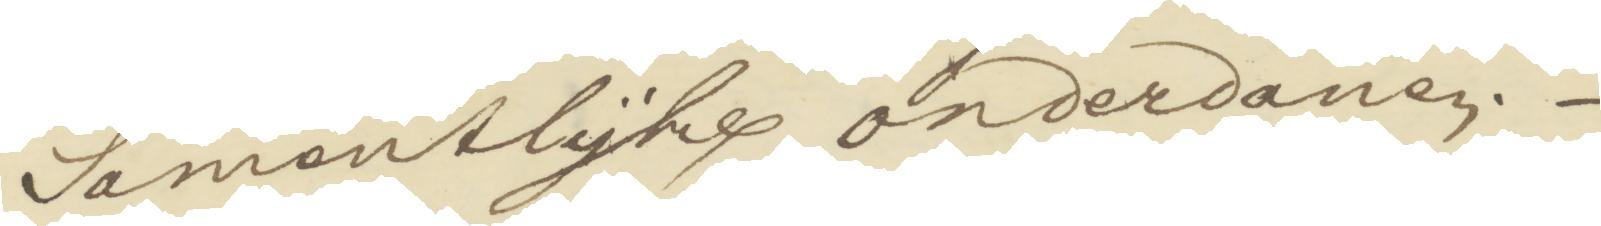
samentlijke onderdanen. —
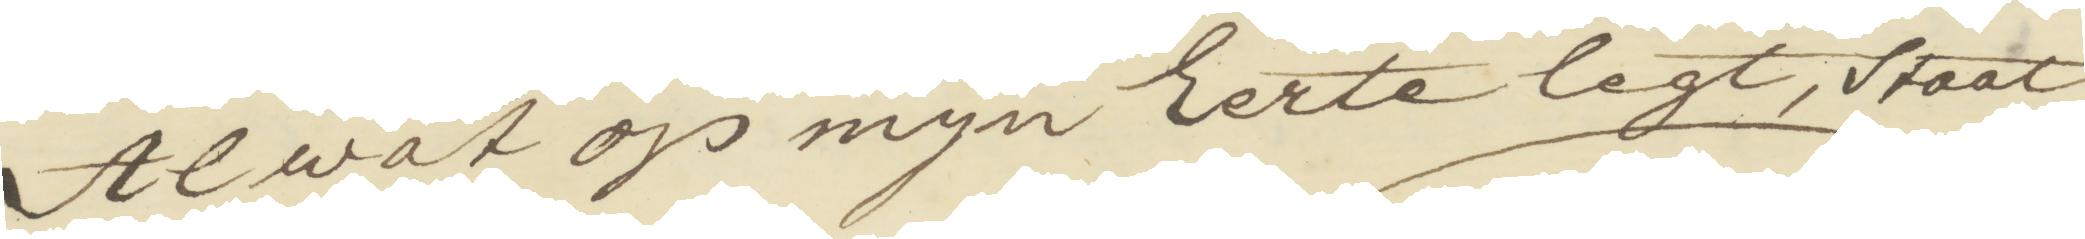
Al wat op mijn herte legt, staat
